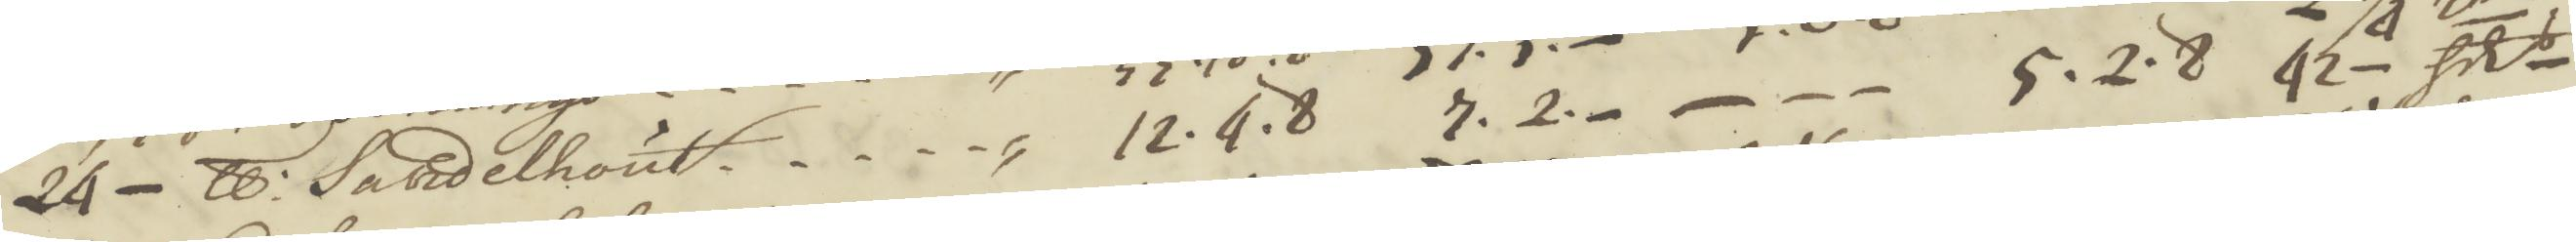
24 – lb: sandelhout - - - - - „ 12.4.8 7. 2.– — – – 5. 2. 8 42 – sch–s
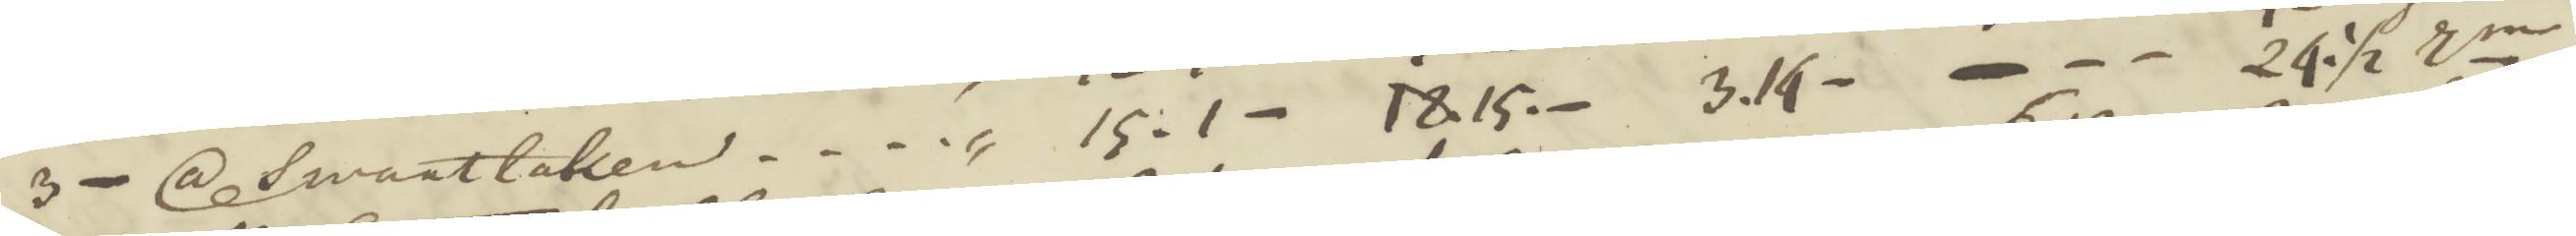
3 — @ swartlaken - - - - „ 15: 1 – 18.15.– 3.14 – — – – 24.½ r–m
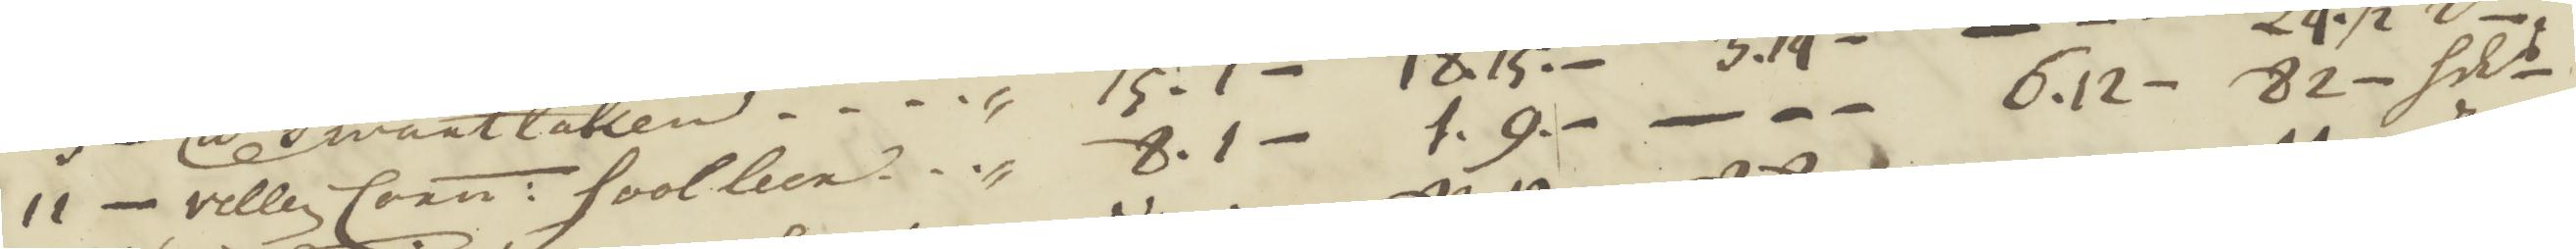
11 — vellen Corn: soolleer - - . „ 8.1 – 1.9. – — – – 6.12 – 82 – sch–s
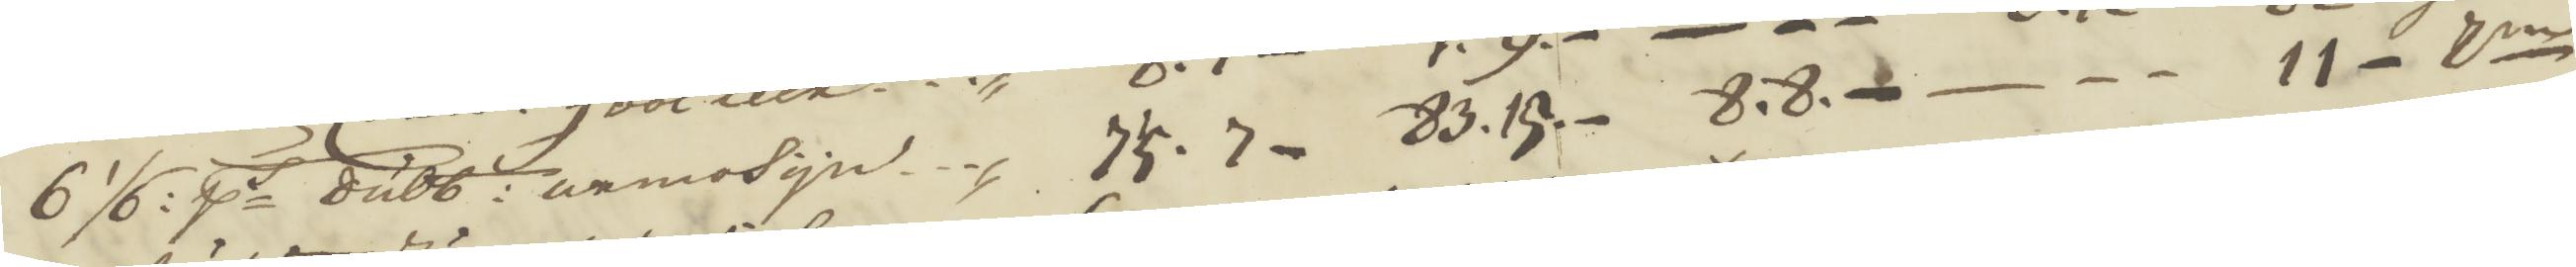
6 1/6: p=s dubb: armosijn - - - „ 75. 7 – 83.15.– 8.8.– — – – 11 – r–m
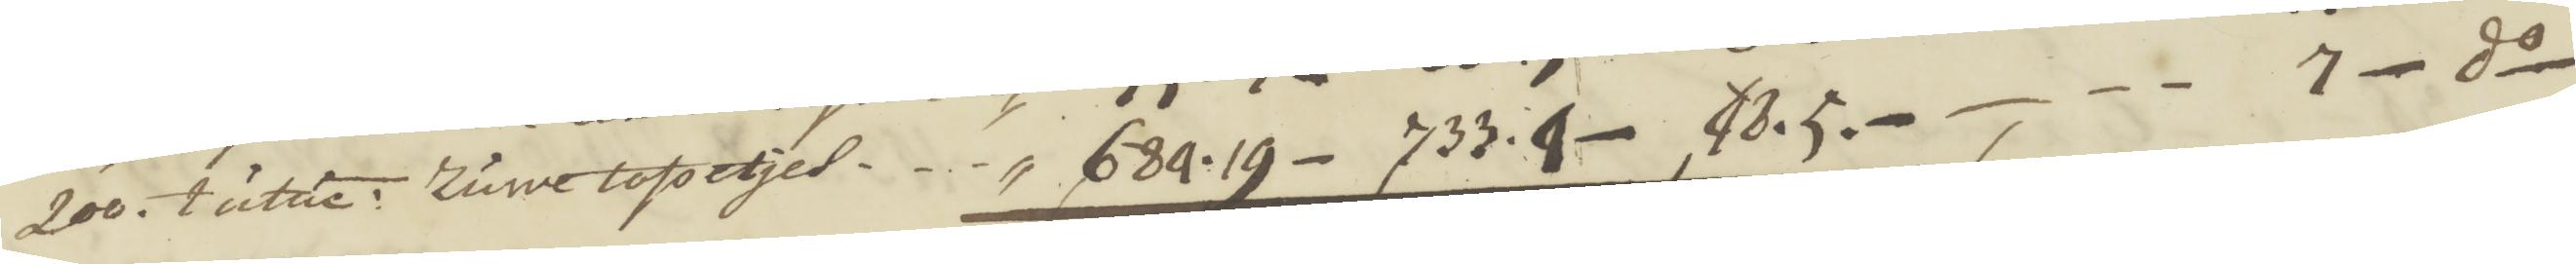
200. tutuc: ruwe topetjes - - . - „ 684.19 – 733. 4– 43.5. – — – – 7 — d–o
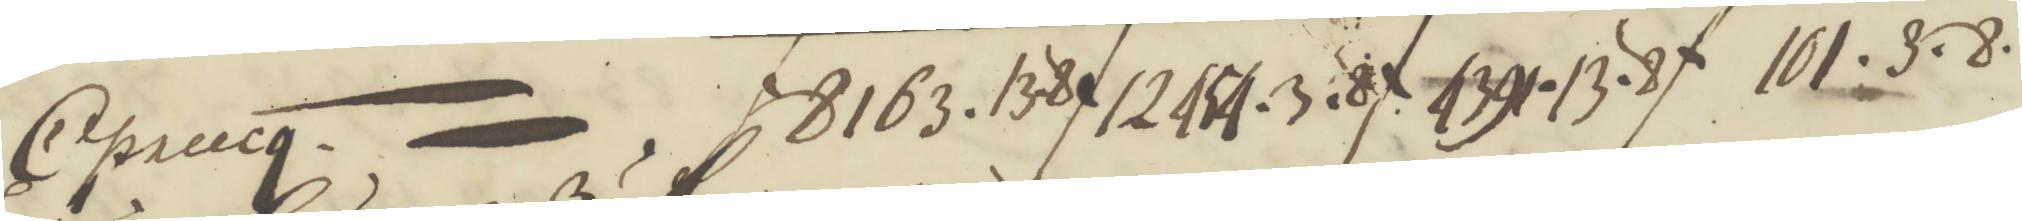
Opreecq. — ƒ8163. 13.8 ƒ12454.3.8ƒ.4391.13.8ƒ 101. 3. 8
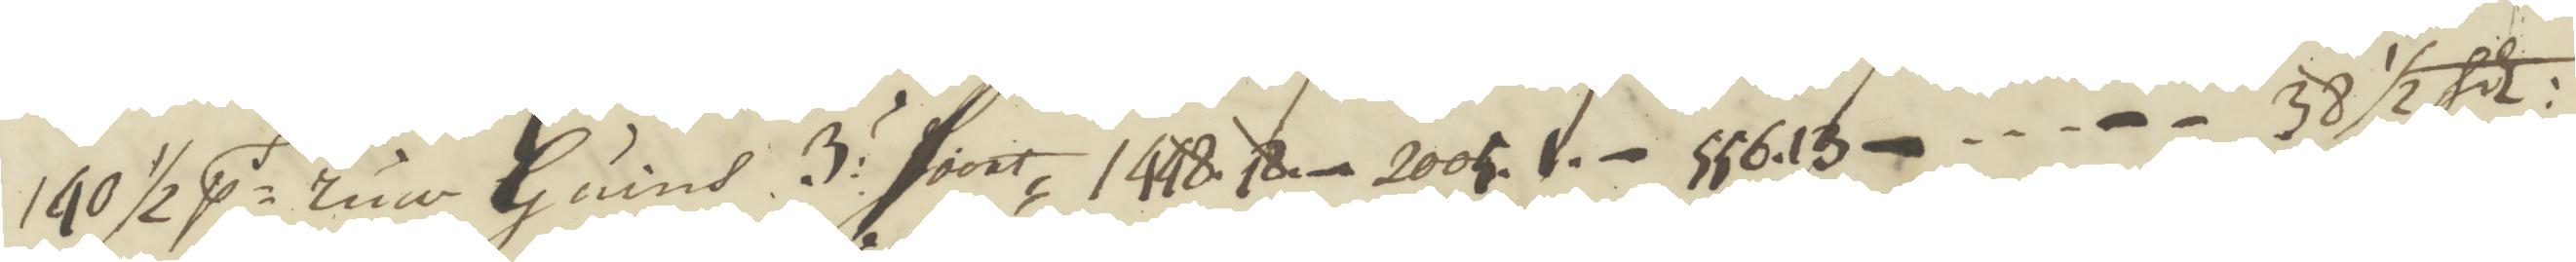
140½ p=s ruw Guins 3:' soort „ 1448. 18.– 2005.1.– 556.13 – - - - – – 38½ sch:
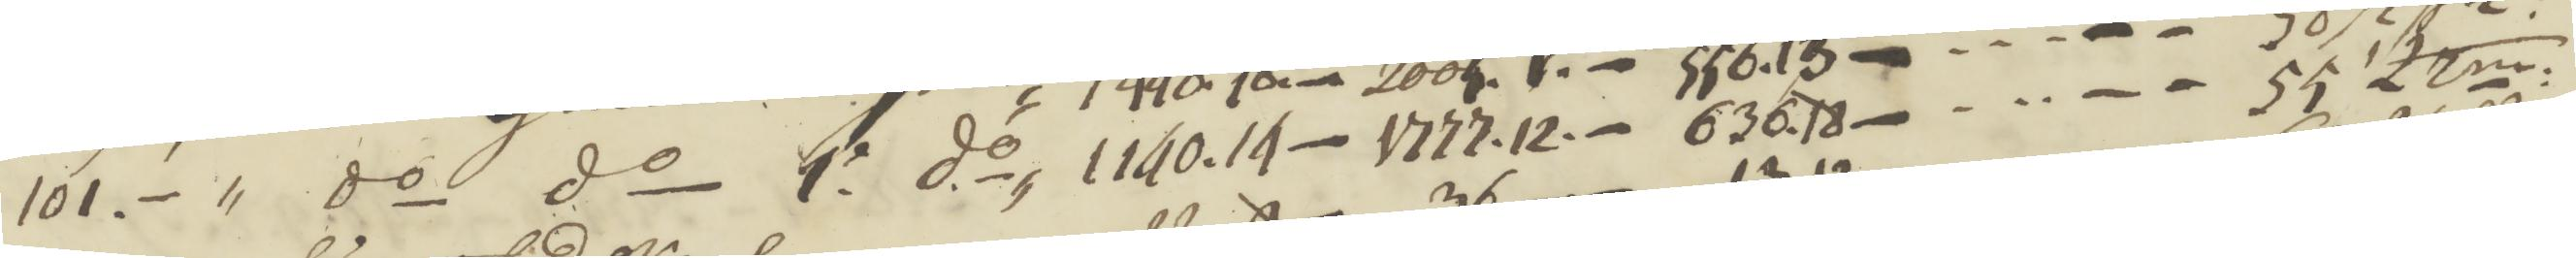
101.– „ d–o d–o 1.e d.–o „ 1140.14 – 1777.12.– 636.18– - - - – – 55½ r–m:
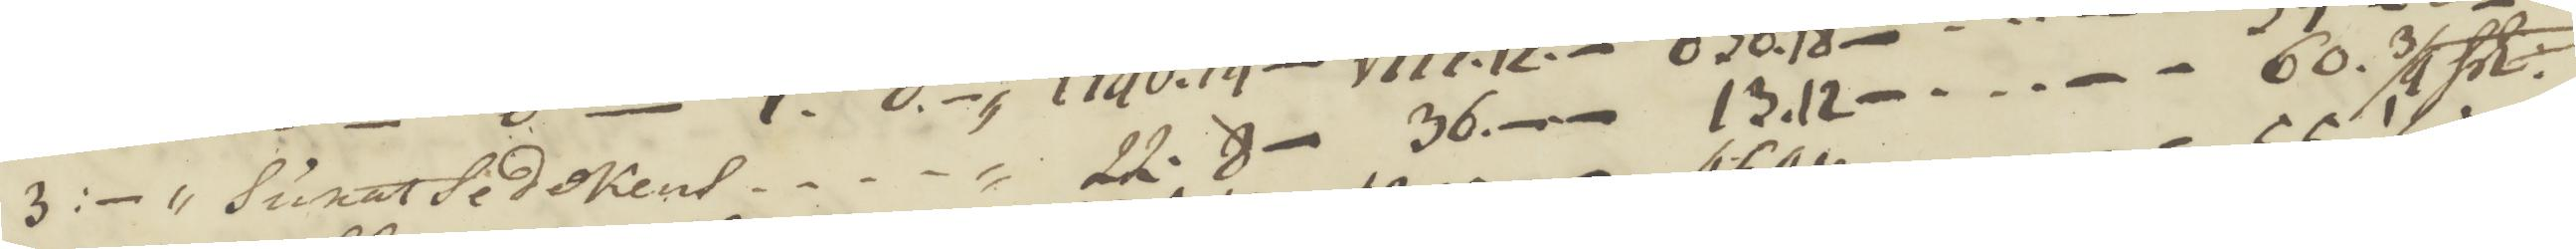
3: – „ suratsedekens - - - - – „ 22. 8– 36.–.– 13.12– - - - – – 60.¾ sch:
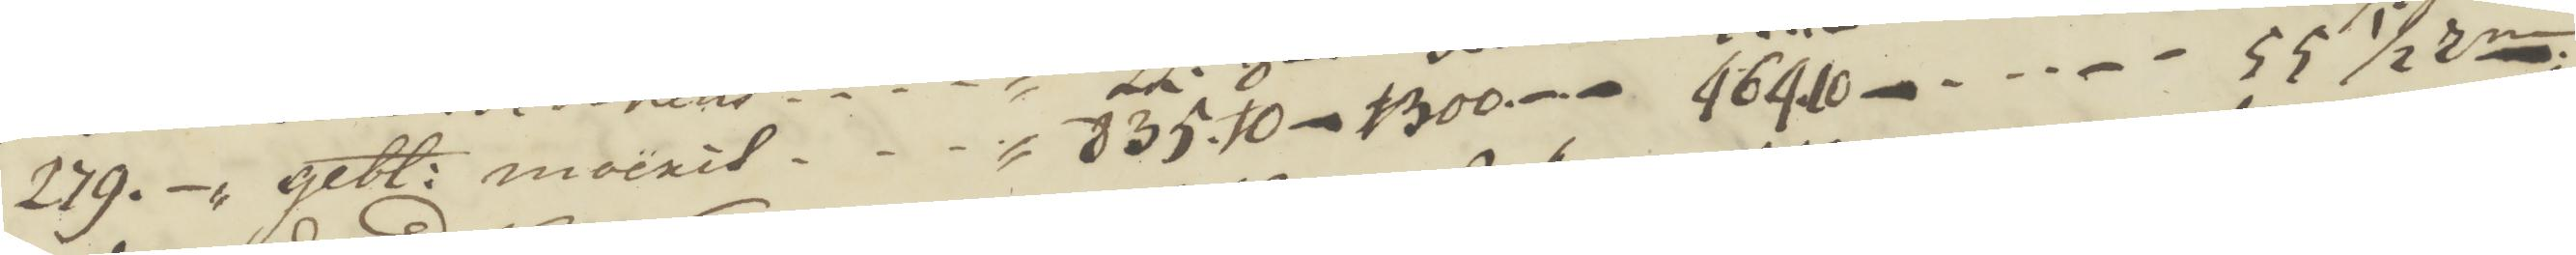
279. –„ gebl: moëris - - - .„ 835.10– 1300.–.– 46410 – - - - – – 55½ r–m.
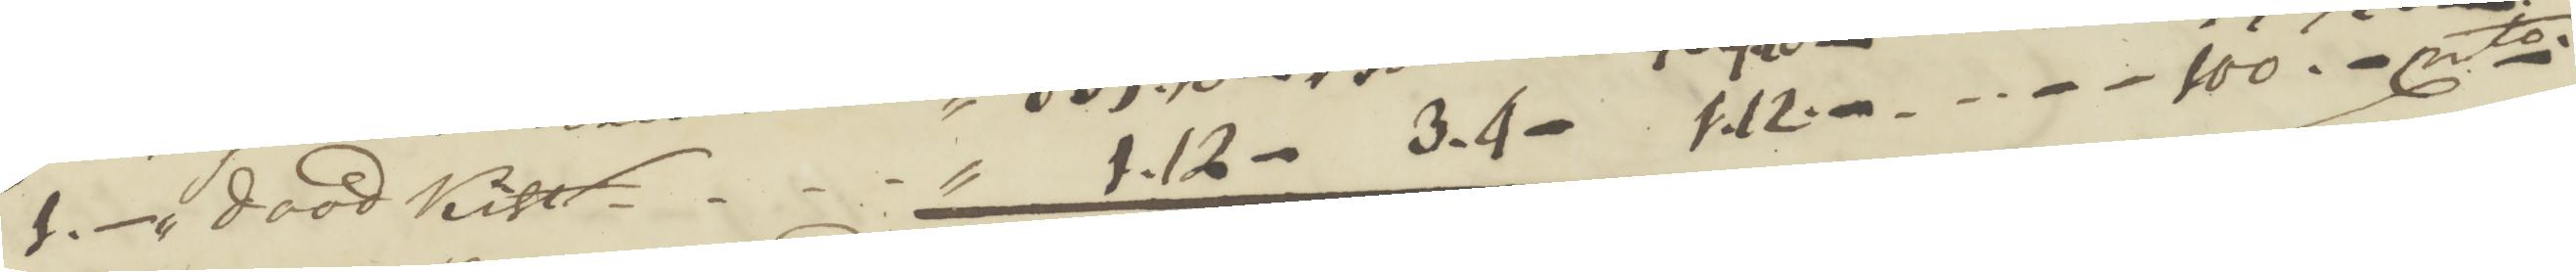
1.–„ dood kist - - - - „ 1.12 – 3.4 – 1.12.– - - - – – 100. – Cr–to
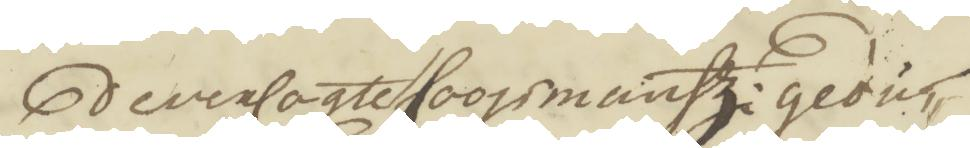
de vercogte Coopmansz: gedu„s
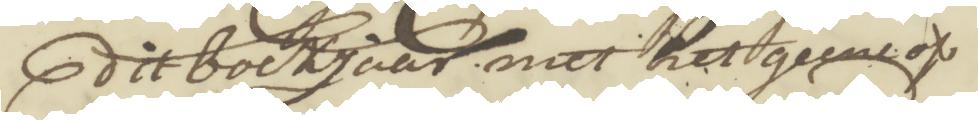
dit boekjaar met het geene op
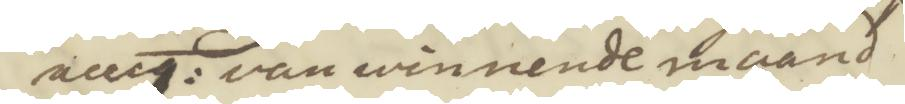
reecq: van winnende maand
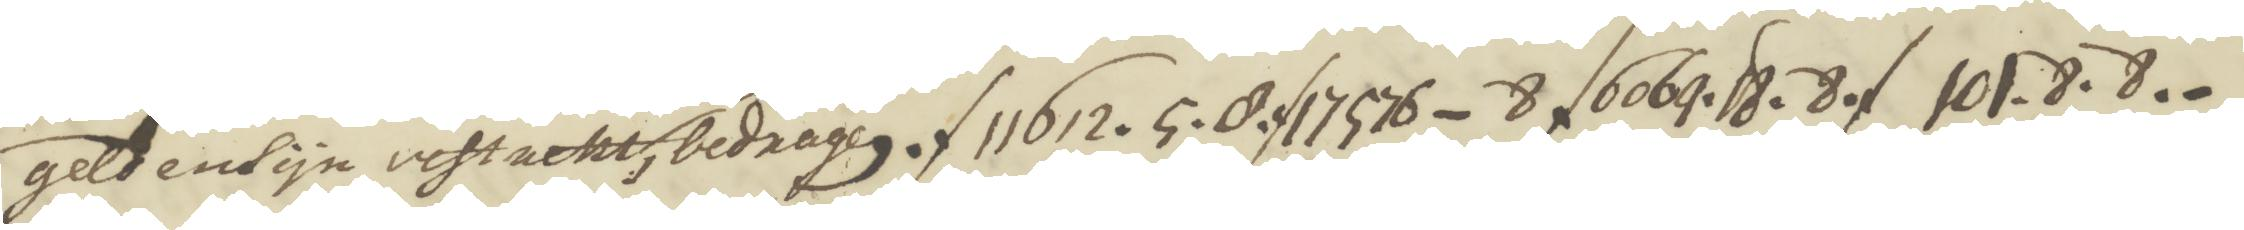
geld en sijn vestrekt, bedragen. ƒ11612. 5. 8. ƒ17576 – 8 ƒ6064. 18. 8. ƒ 101. 8. 8. –
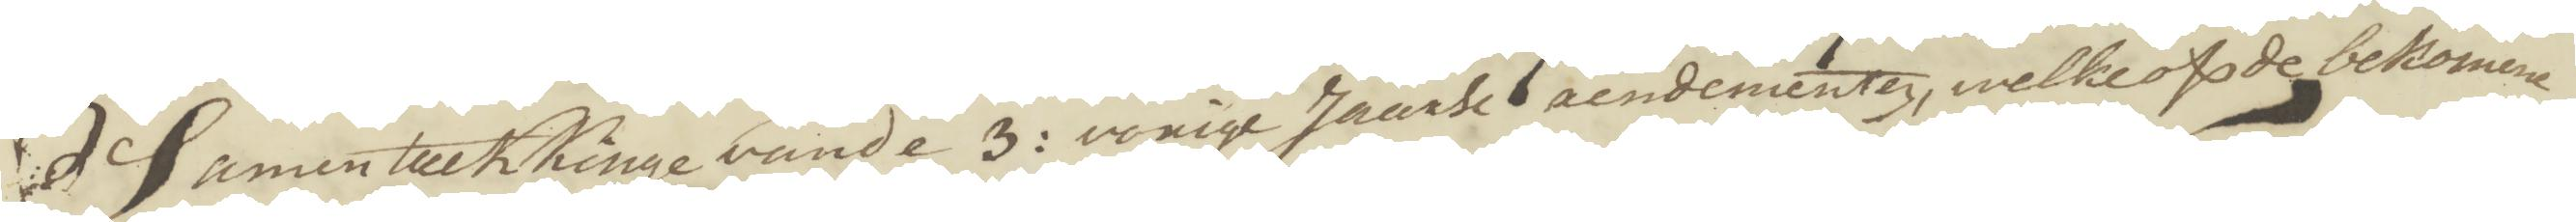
Samentrekkinge vande 3: vorige Jaarse rendementen, welke op de bekomene
